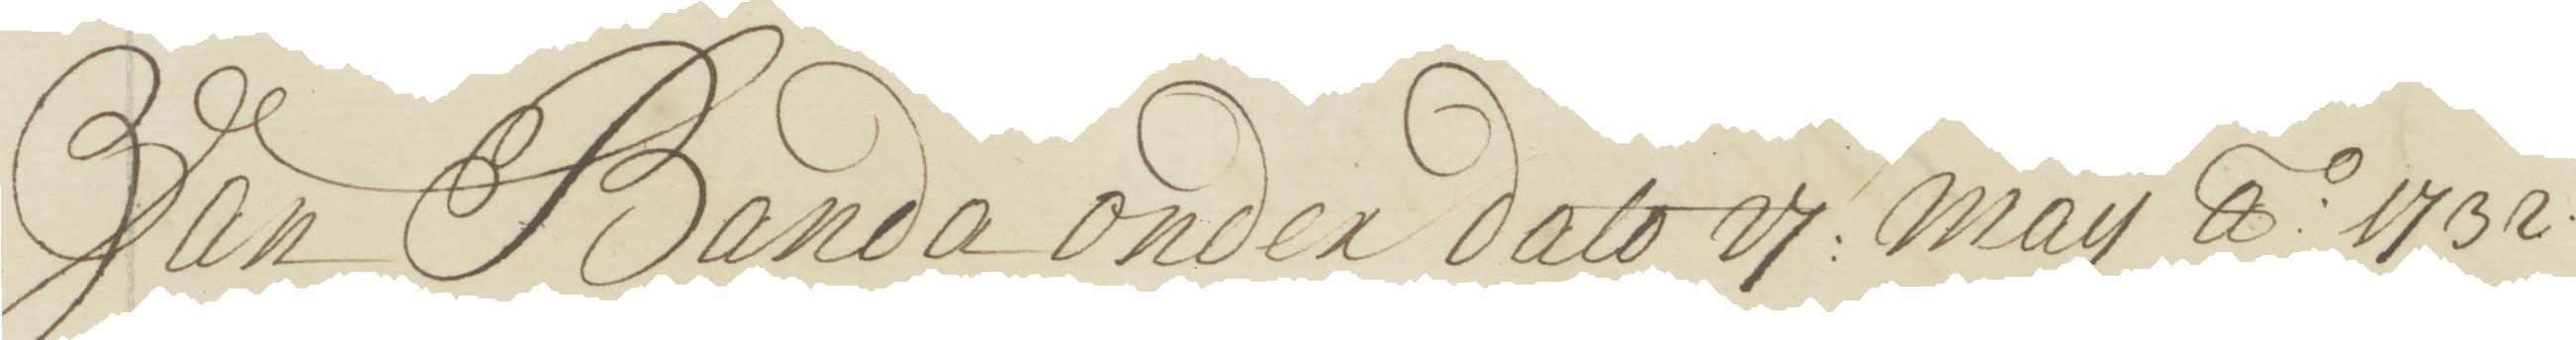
Van Banda onder dato 27:' Maij A:o 1732
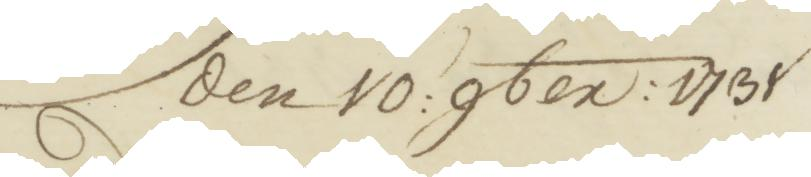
den 10:' 9ber: 1731
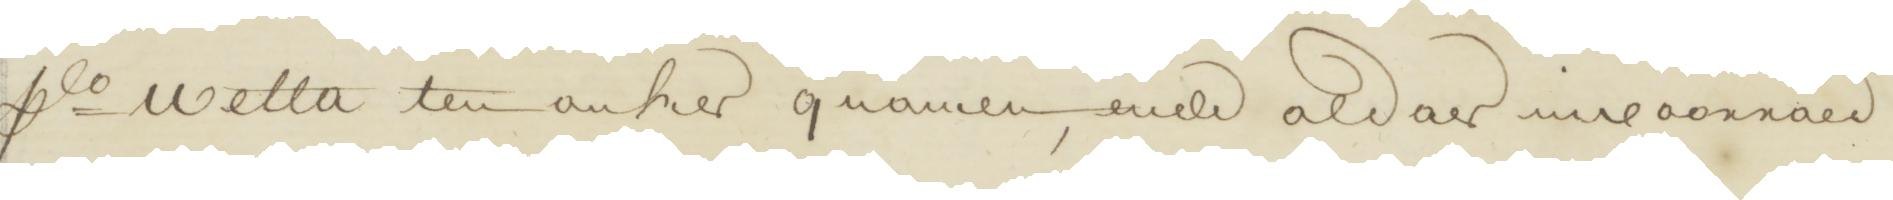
p=lo wetta ten anker quamen, ende aldaer uw vorraed
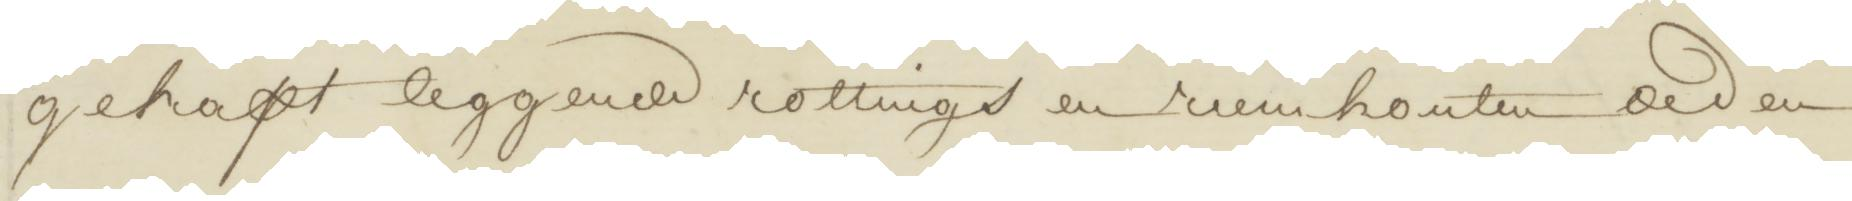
gekapt leggende rottings en riemhouten deden
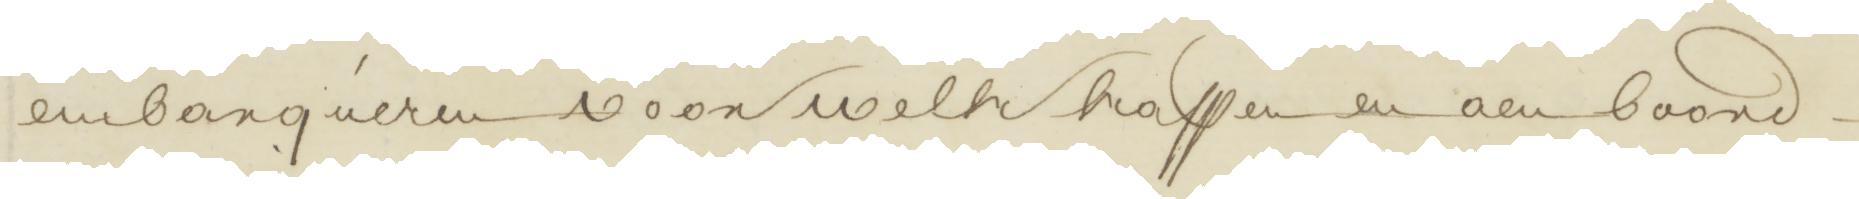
embarqueren voor welk kappen en aen boord
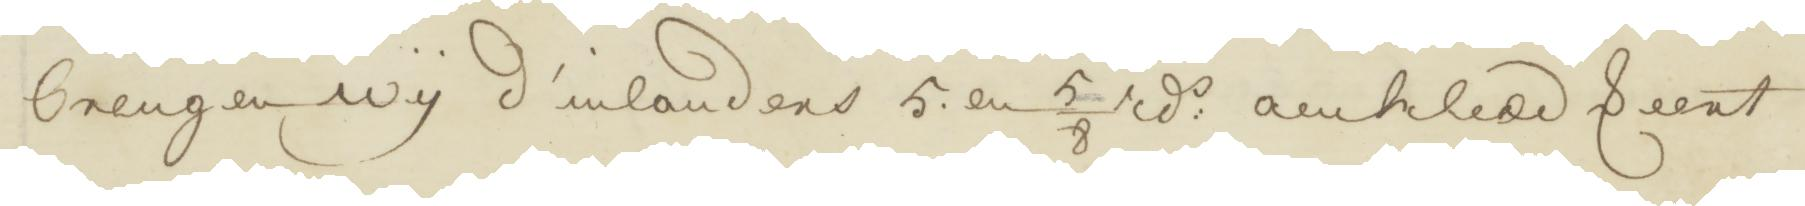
brengen wij d’ inlanders 5. en 5/8 rd:s aen klede vereert
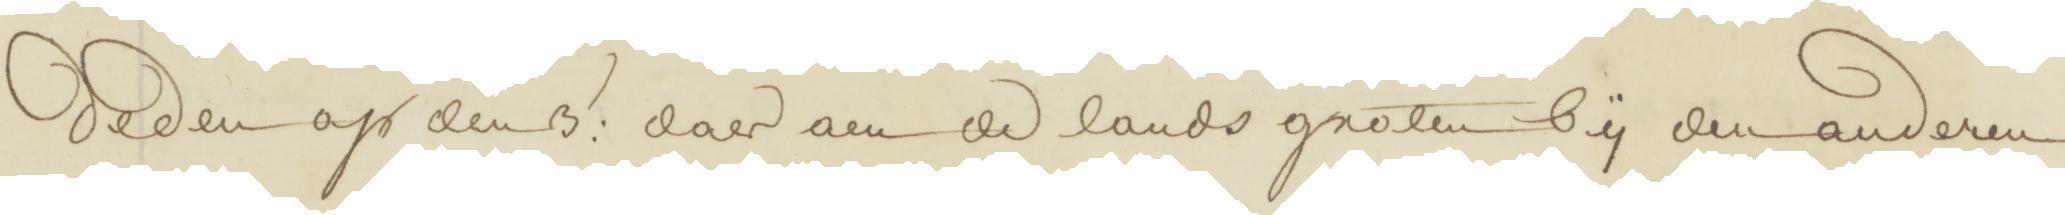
deden op den 3:' daer aen de lands groten bij den anderen
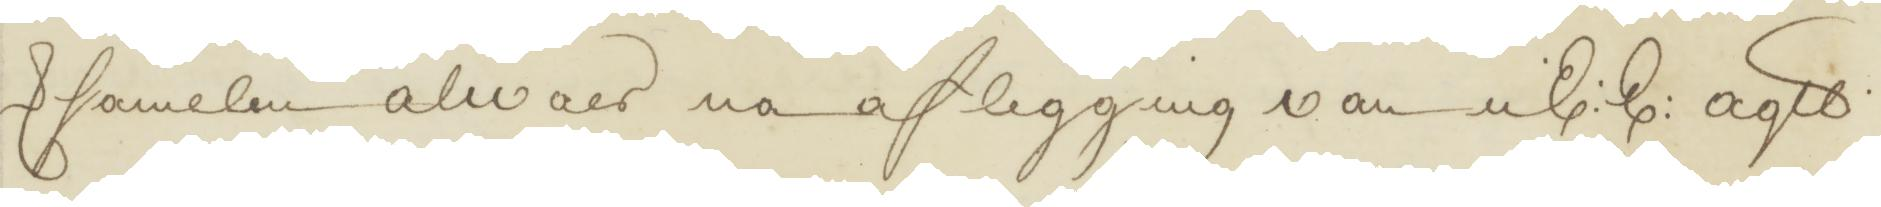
versamelen, alwaer na aflegging van u E: E: agtb:
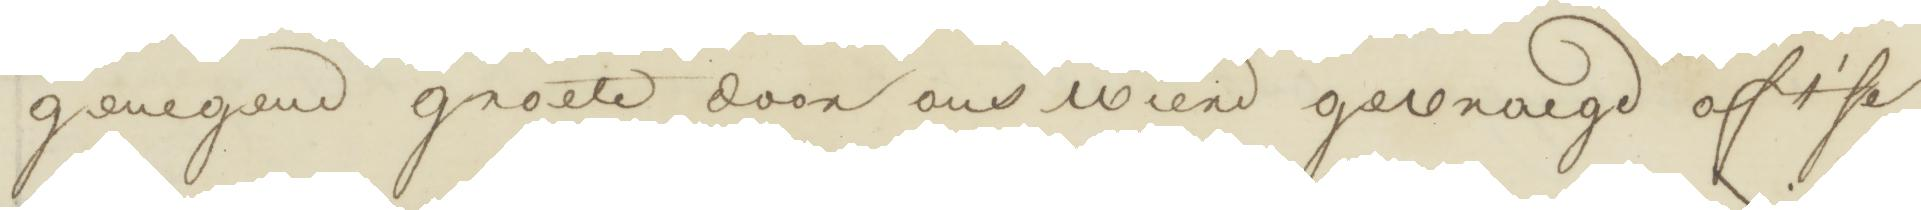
genegene groete door ons wierd gevraegd of t' Se
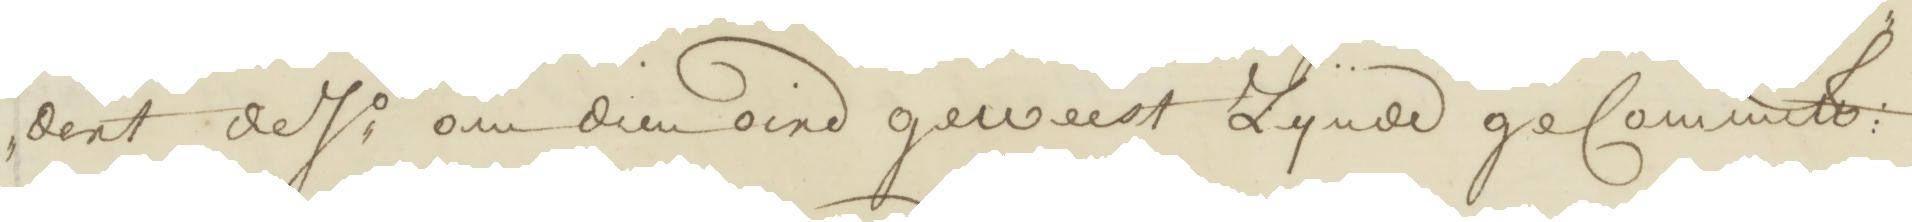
„dert de J„o om dien oird geweest Zijnde gecommitt:s
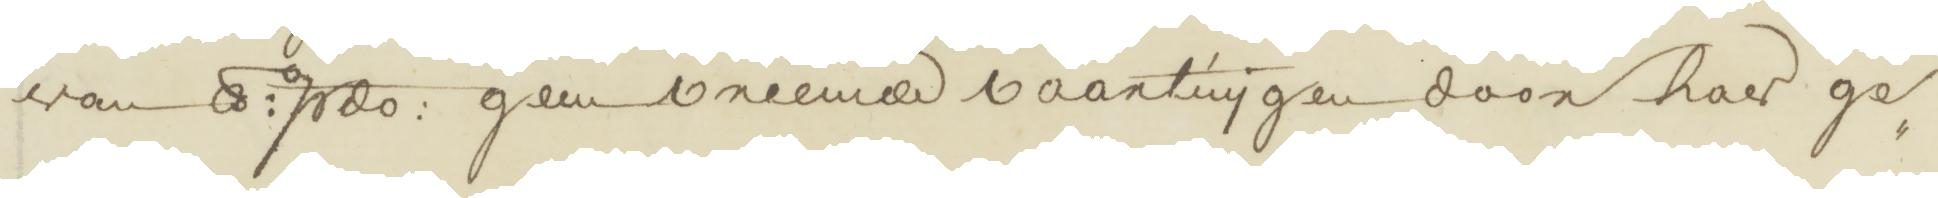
van d:o plo: geen vreemde vaartuijgen door haer ge„
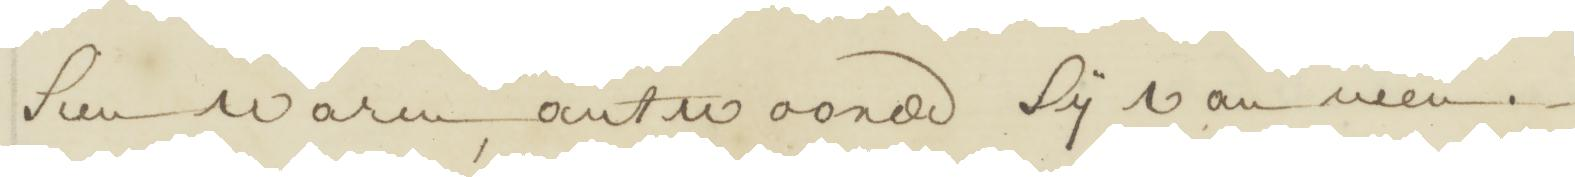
Sien waren, antwoorde sij van neen.
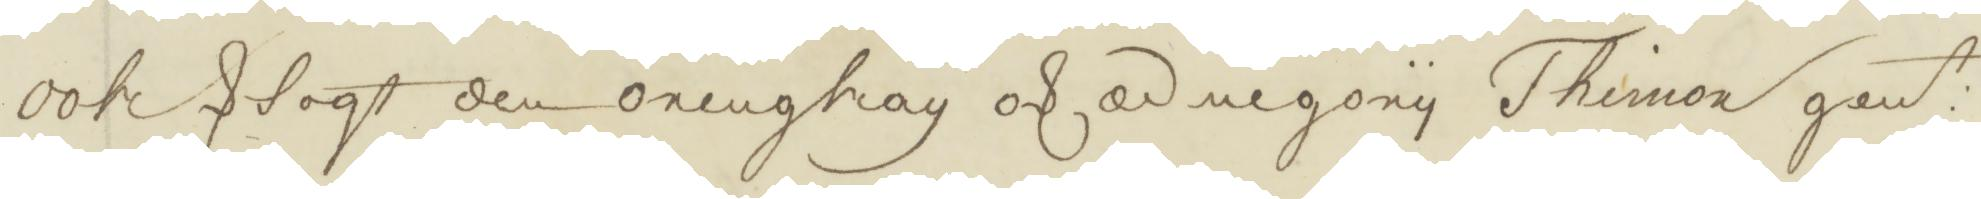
ook versogt den orengkaij over de negorij Thimor gen:t
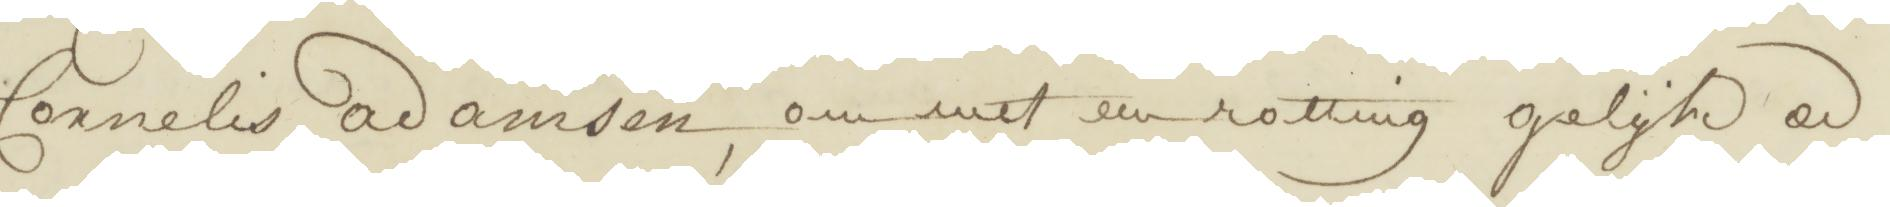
Cornelis adamsen, om met een rotting gelijk de
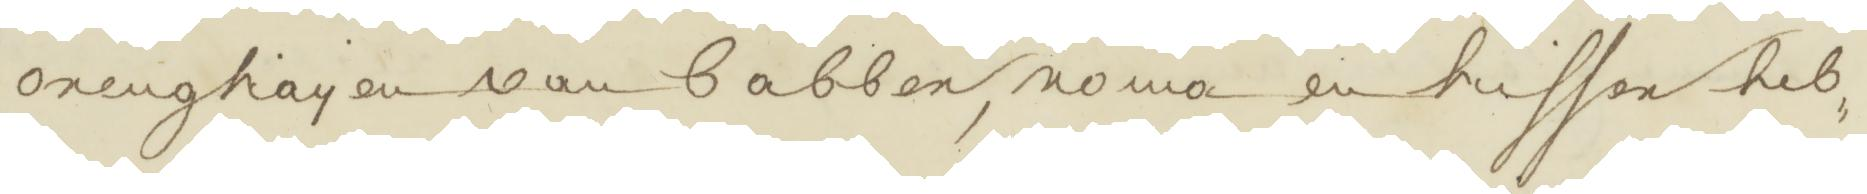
orengkaijen van babber, roma en kisser heb„
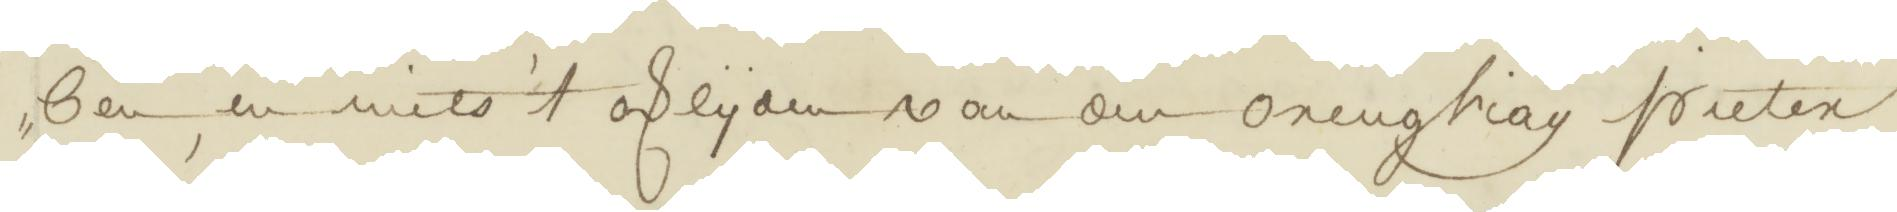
„ben, en mits ’t overlijden van den orengkay pieter
